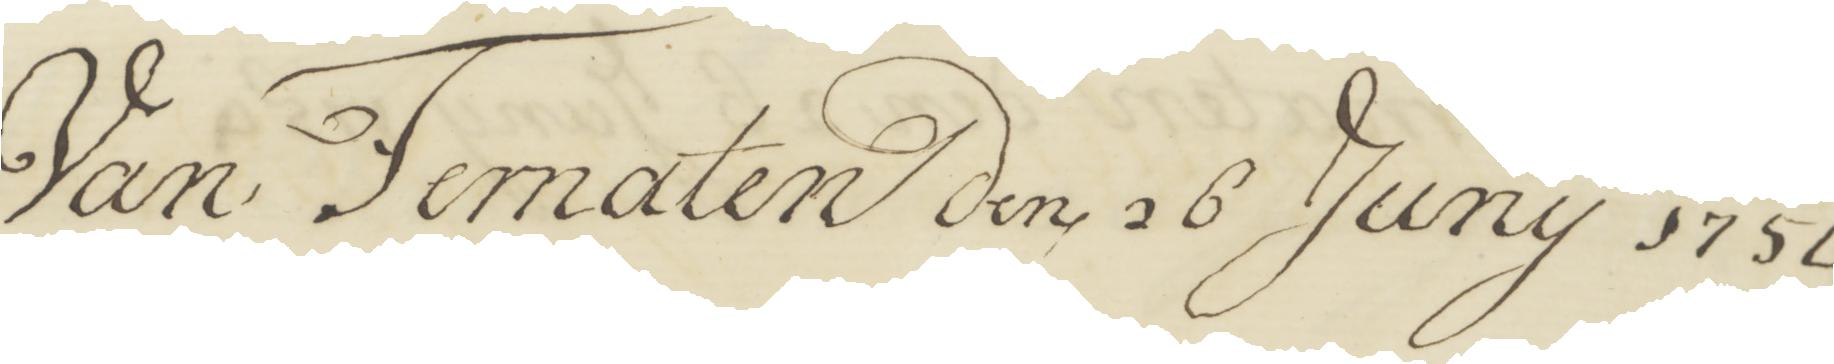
Van Ternaten den 26 Juny 1754
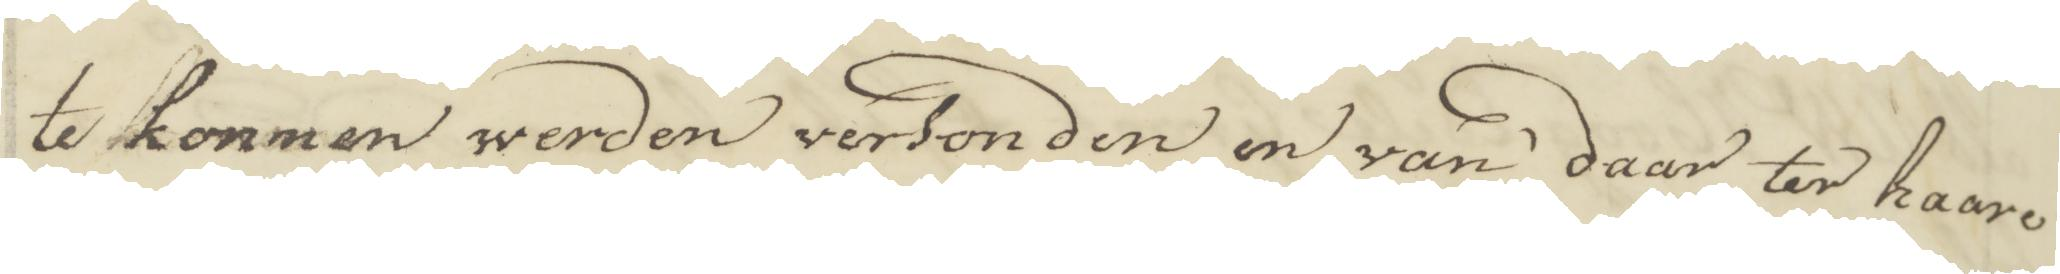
te konnen werden versonden en van daar ter haare
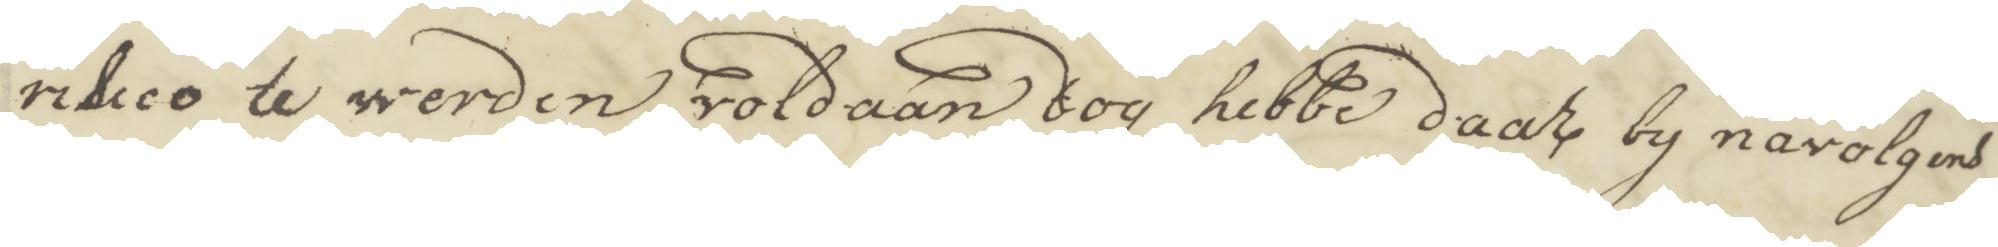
risico te werden voldaan dog hebbe daar by navolgens
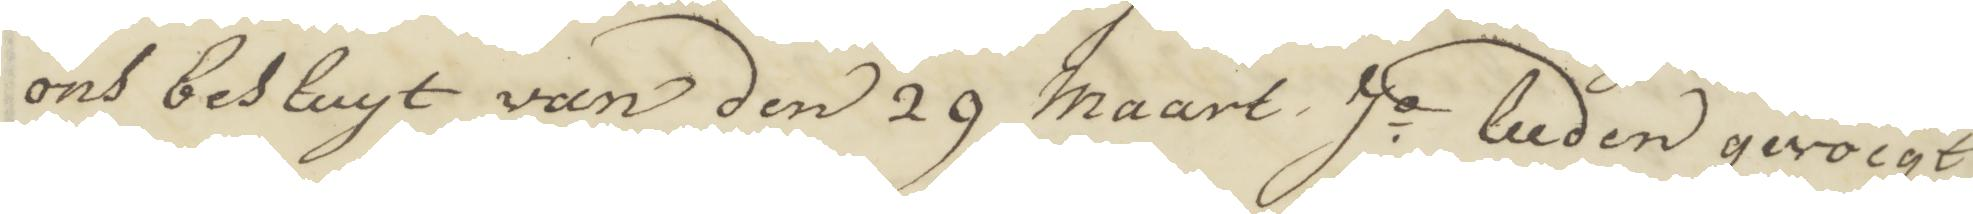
ons besluyt van den 29 Maart J=o leeden gevoegt
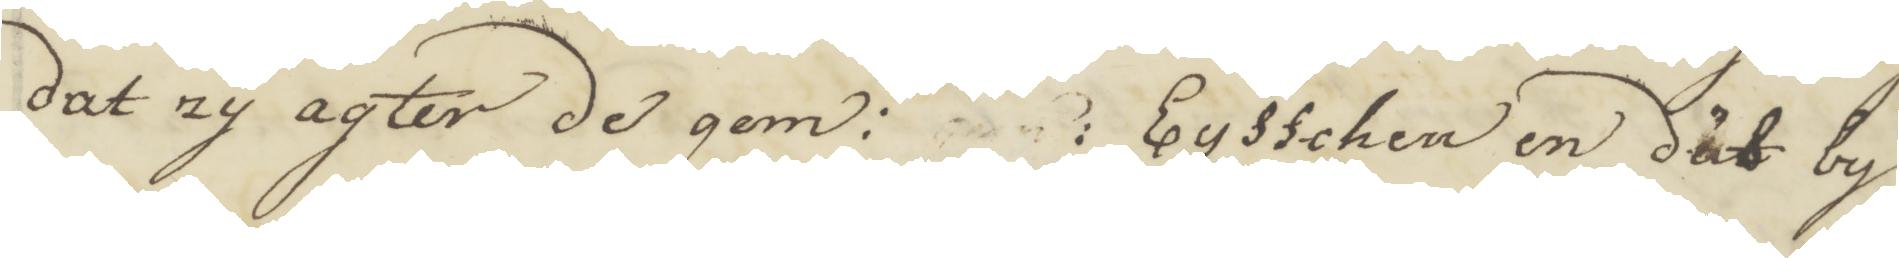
dat zy agter de gem: : Eysschen en dat by
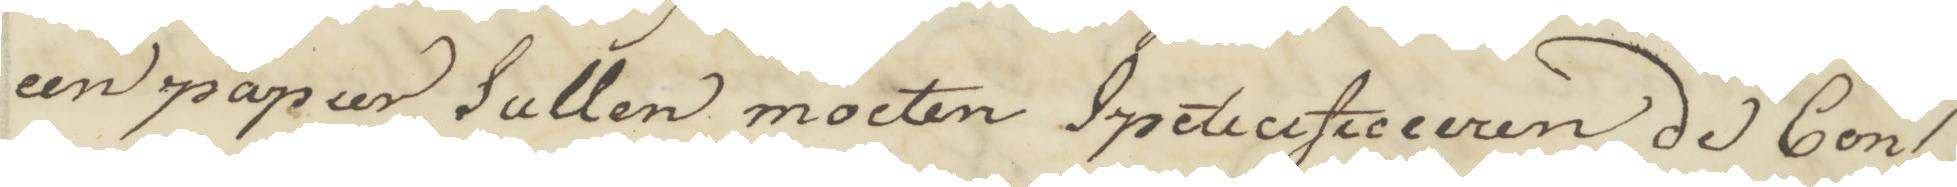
een papier sullen moeten speticificeeren de Con
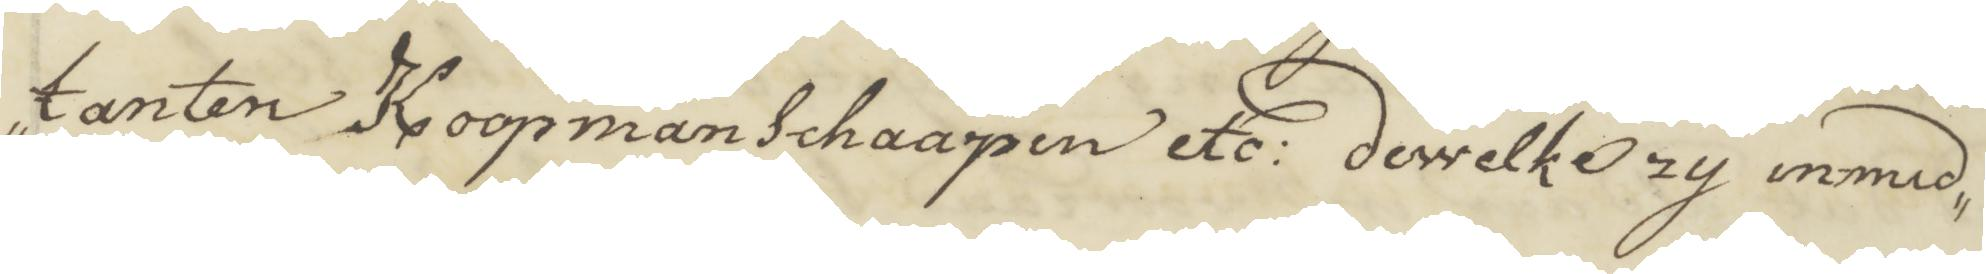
„tanten Koopmanschaapen etc: dewelke zy inmid„
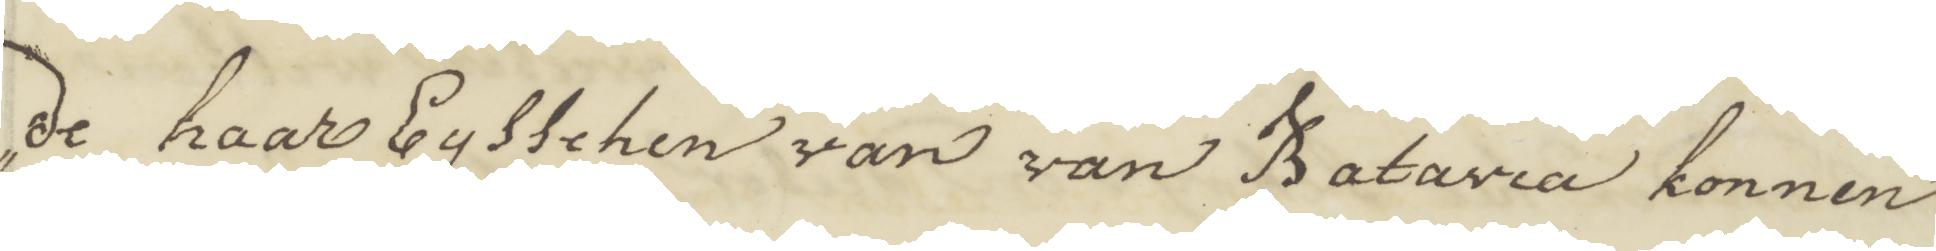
„de haar Eysschen van van Batavia konnen
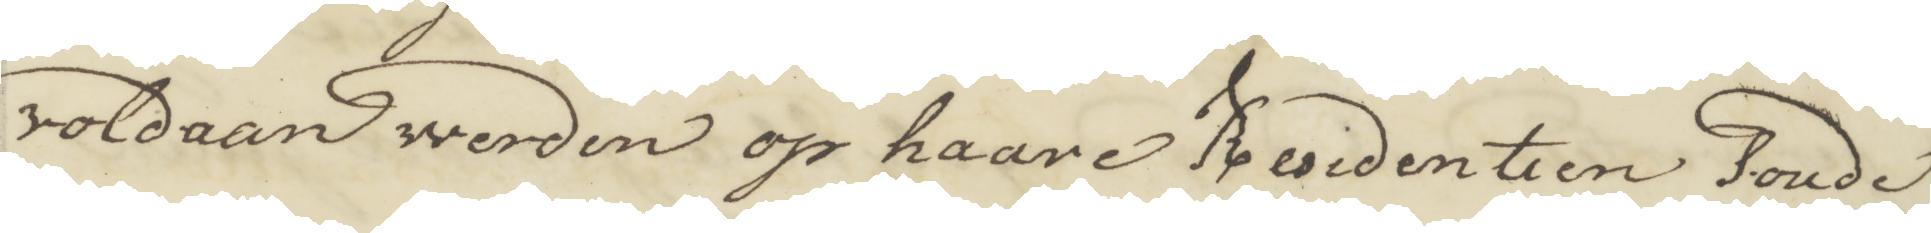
voldaan werden op haare Residentien soude
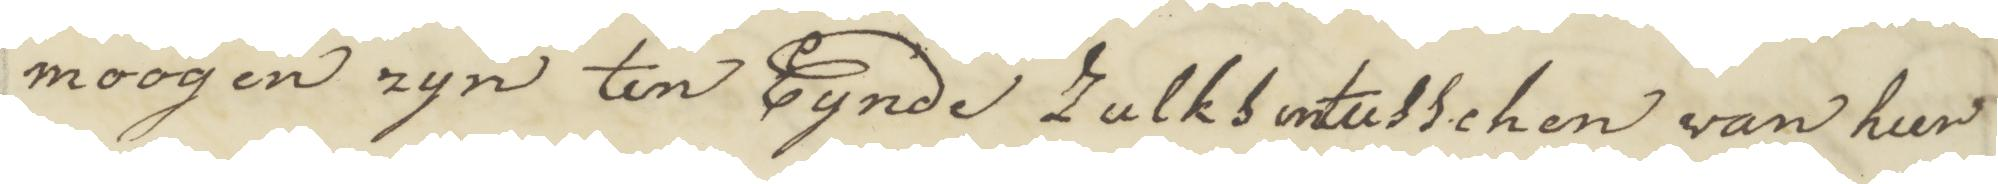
moogen zyn ten Eynde zulks intusschen van hier
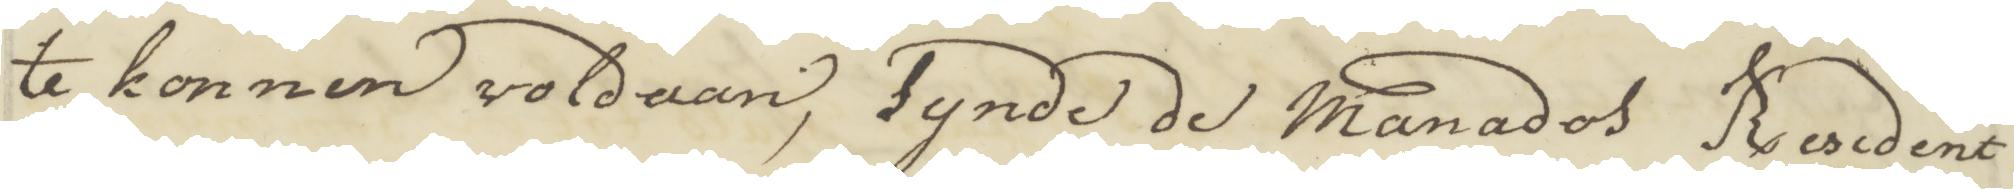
te konnen voldaan, synde de manados Resident
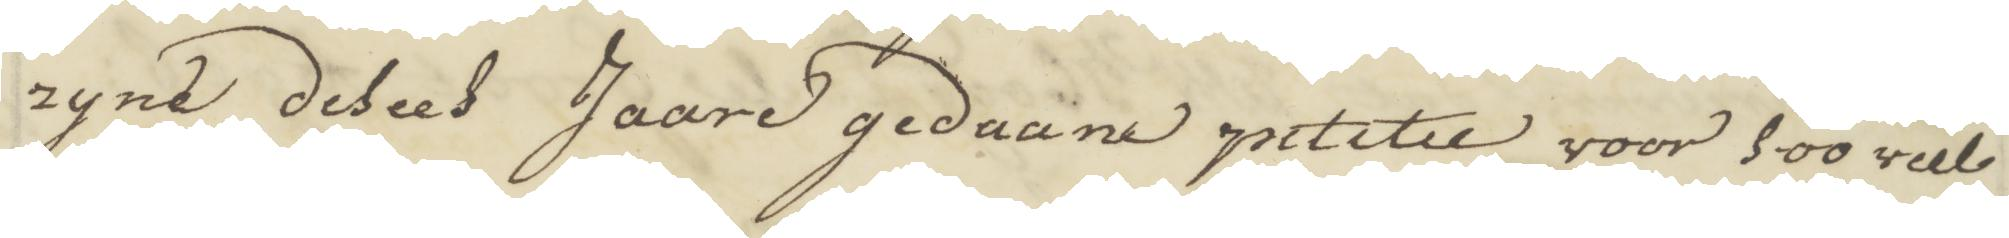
zyne desees Jaare gedaane pititie voor soo veel
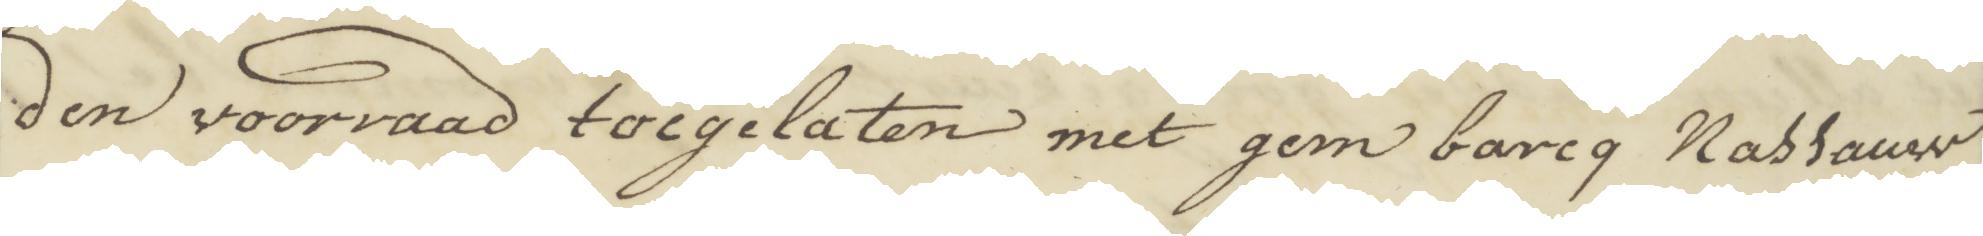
den voorraad toegelaten met gem barcq Nassauw
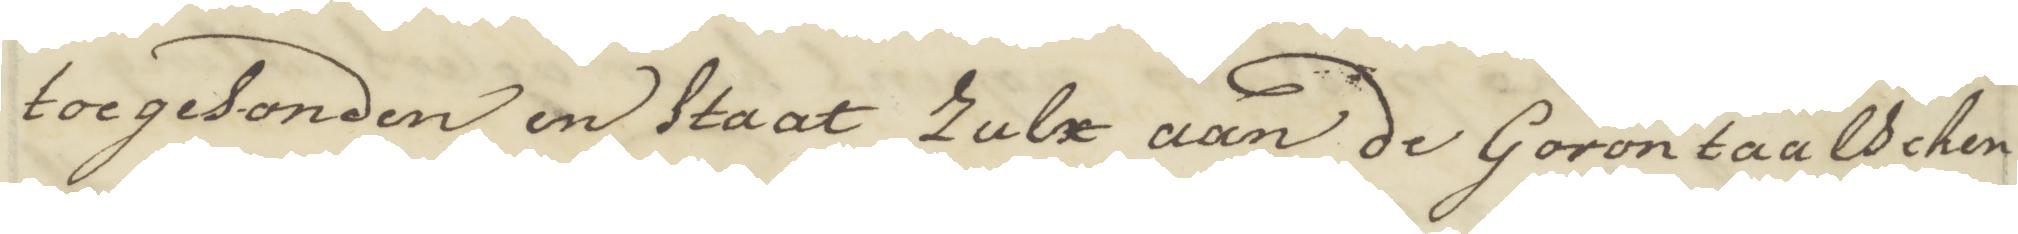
toegesonden, en staat zulx aan de Gorontaalschen
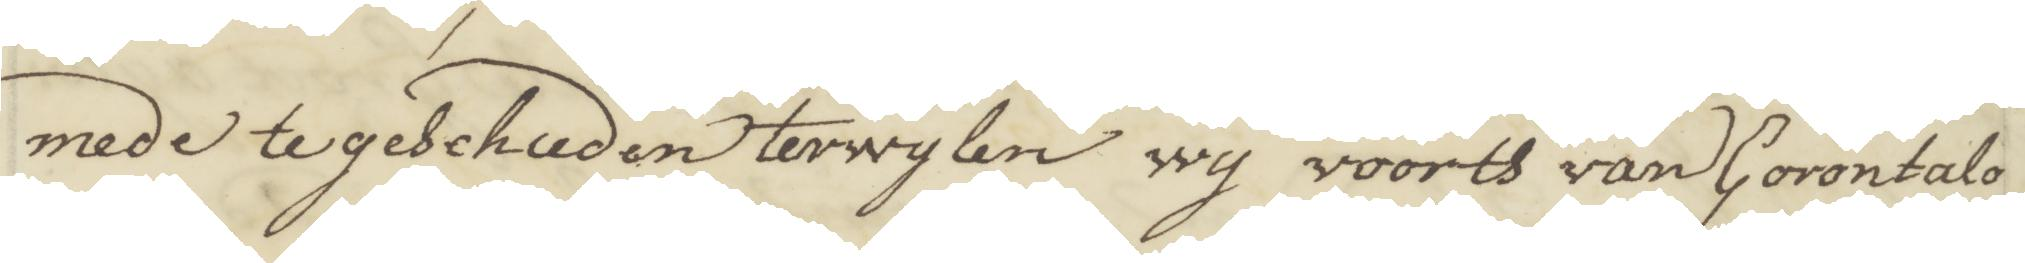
mede te geschieden terwylen wy voorts van Gorontalo
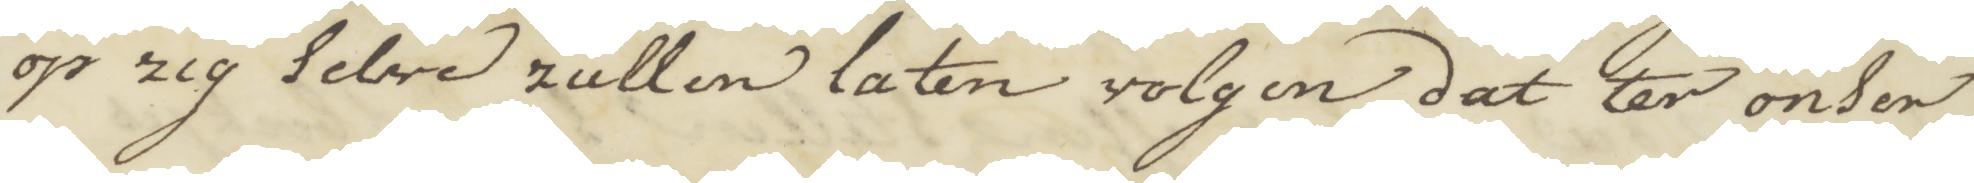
op zig selve zullen laten volgen dat ter onser
